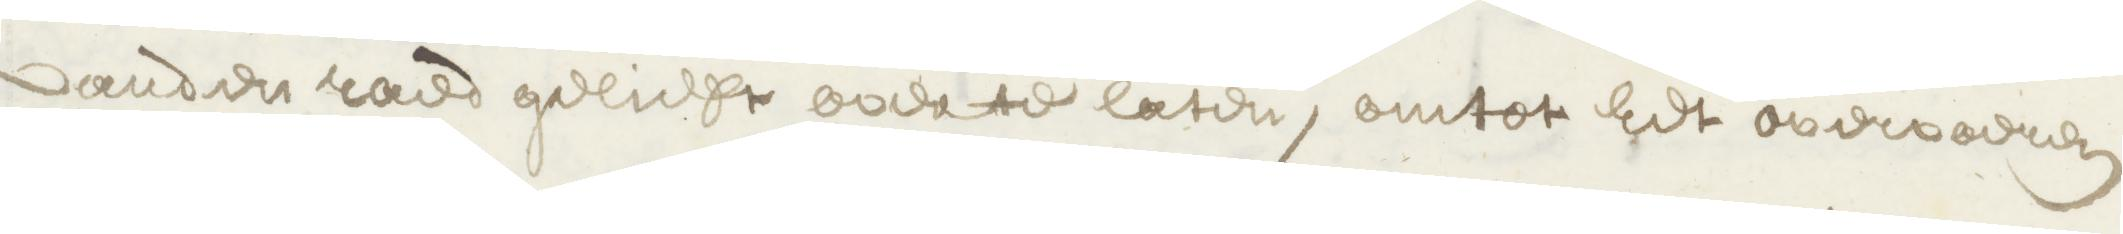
vanden raed gelieft over te laten, om tot het overvoeren
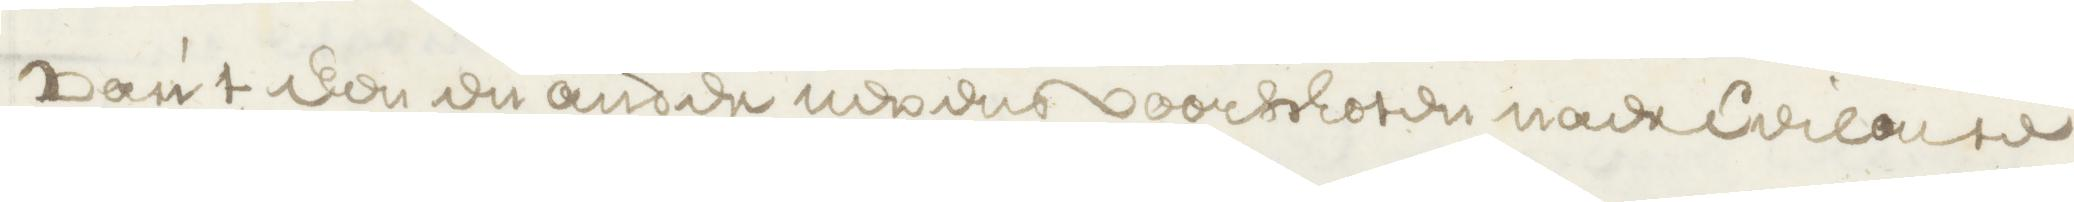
van ’t Een en ander nevens voorschoten naer Ceilon te
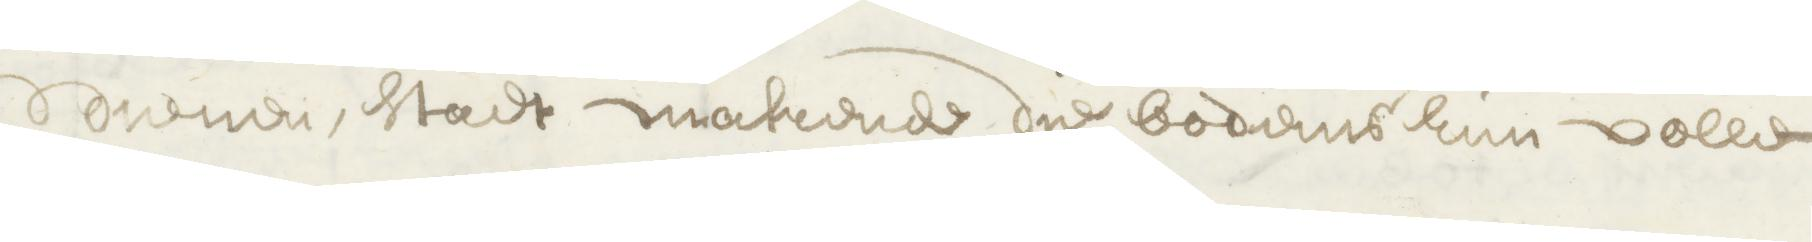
dienen, staet makende die bodems hun volle
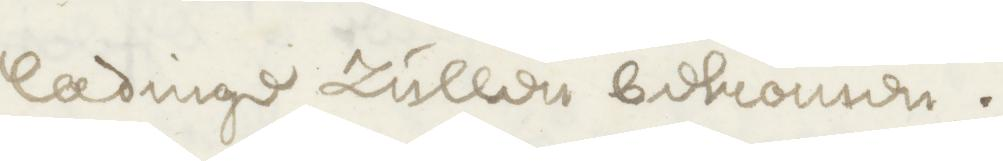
ladinge zullen bekomen.
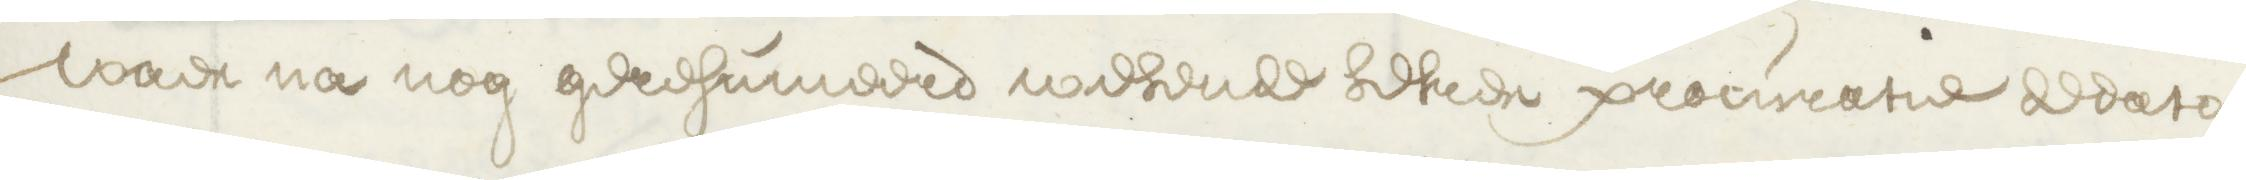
waer na nog geresumeerd wesende seker procuratie de dato
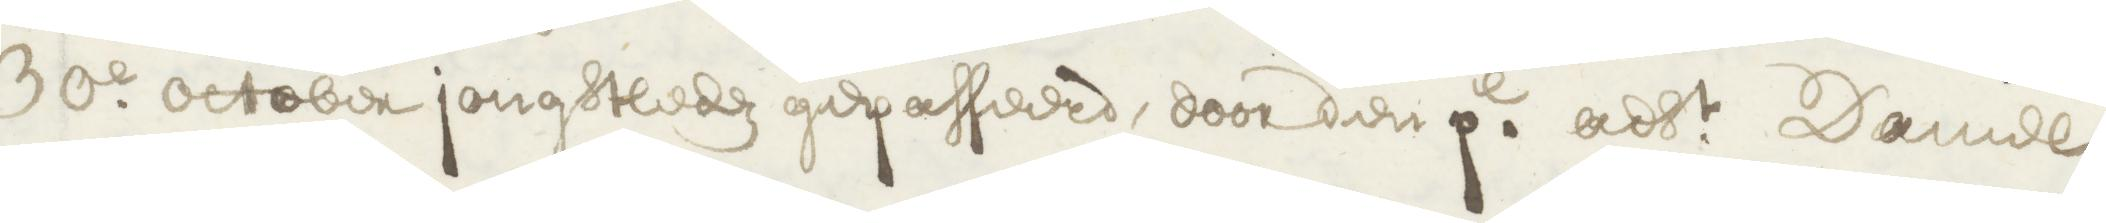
30.e october jongstleden gepasseerd, door den p.e ads:t Daniel
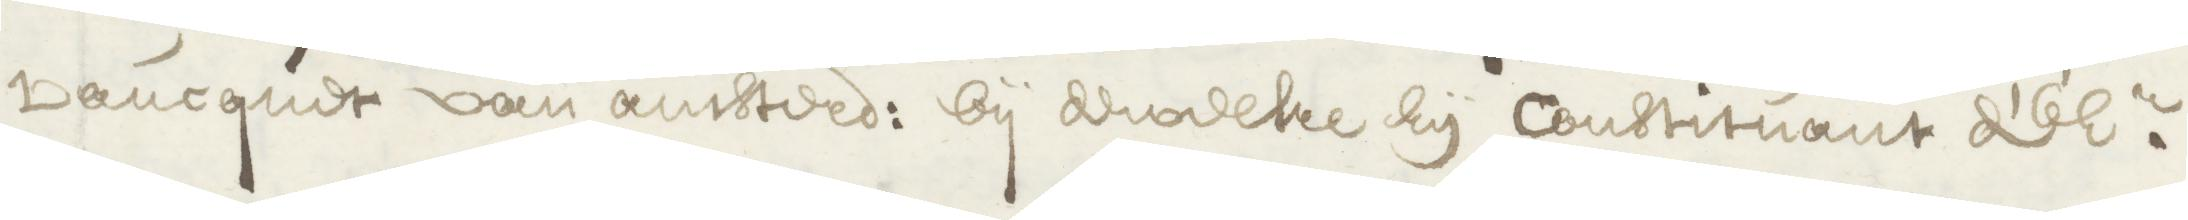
vaucquet van amsterd: bij dewelke hij constituant d'Eh.'
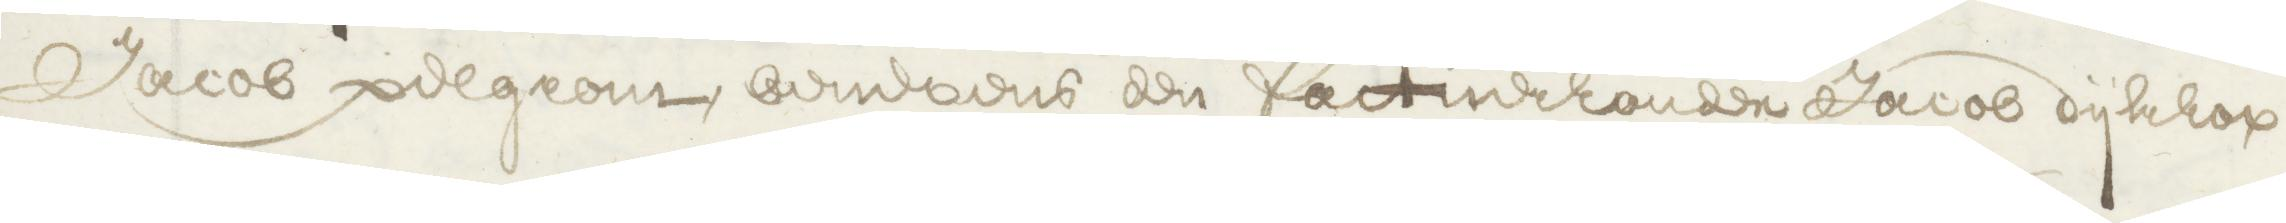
Iacob pelgrom, benevens den factuerhouder Iacob dijkhop
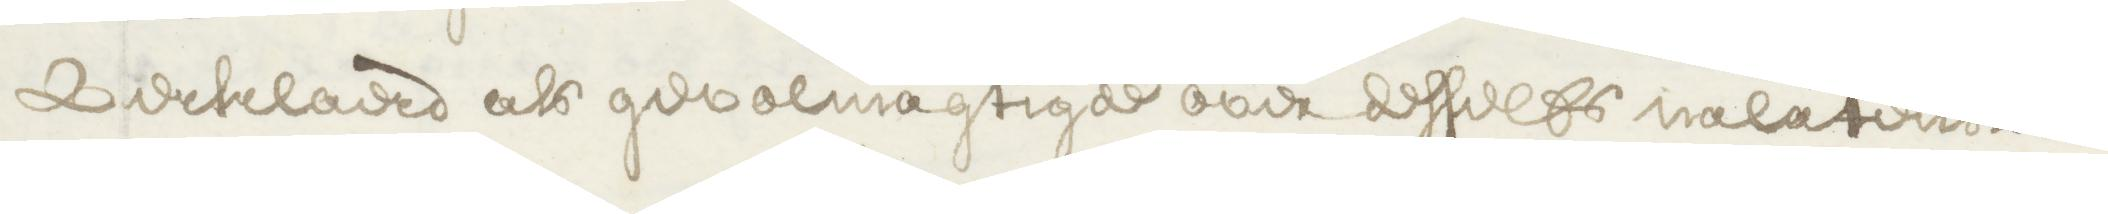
Verklaerd als gevolmagtigde over desselfs nalatensz:—
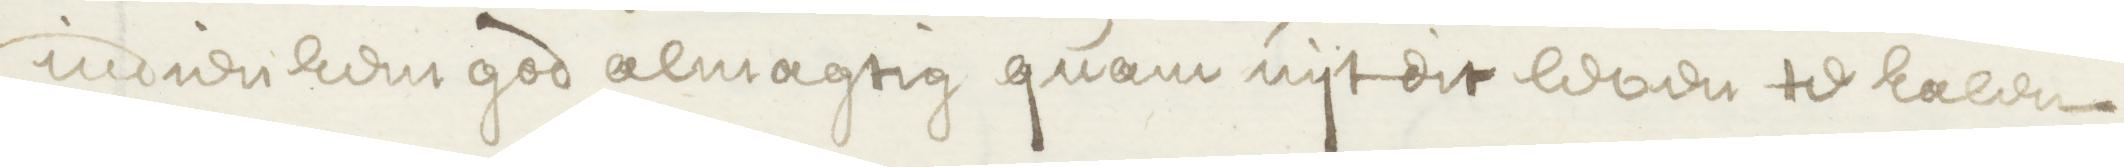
indien hem god almagtig quam uijt dit leven te halen
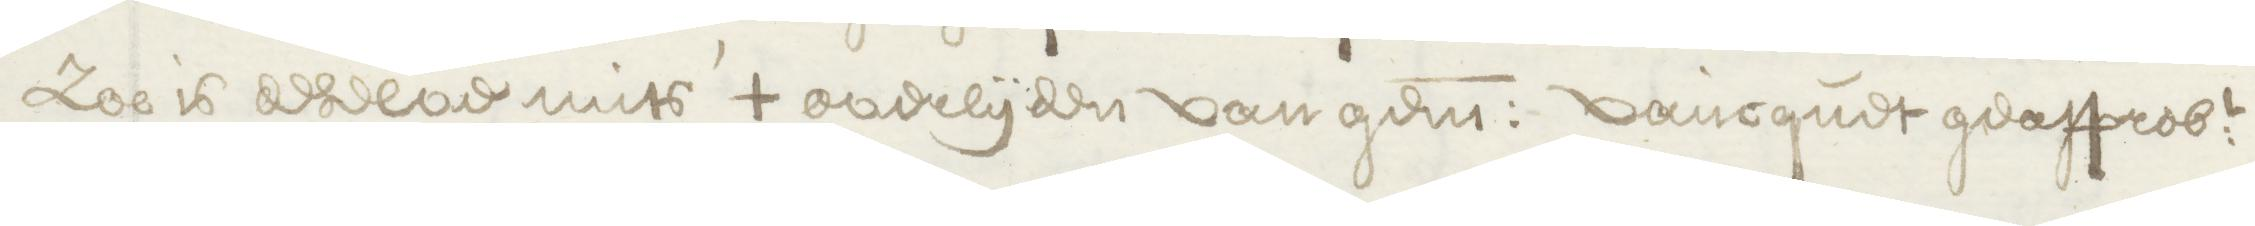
zoo is deselve mits ’t overlijden van gem: vancquet geapprob:t
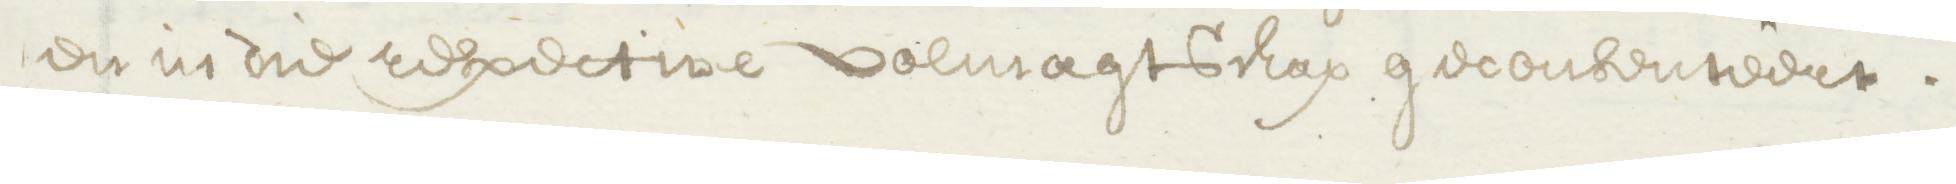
en in die respective volmagtschap geconsenteert.
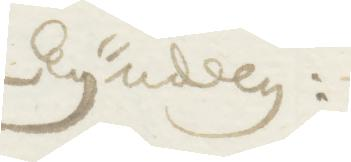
Eijndely„
